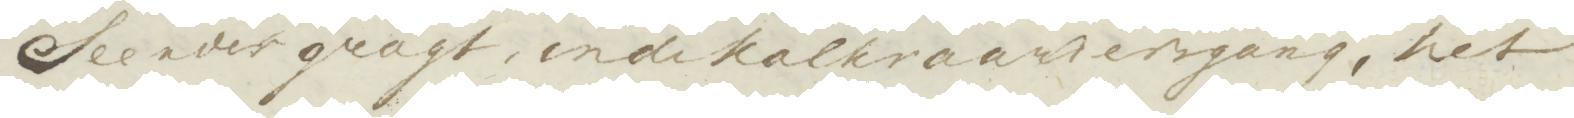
Seerdergragt, in de kalkvaardersgang, het
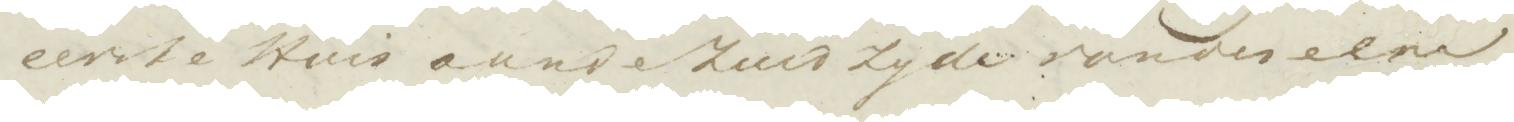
eerste Huis aan de zuid zijde van deselve,
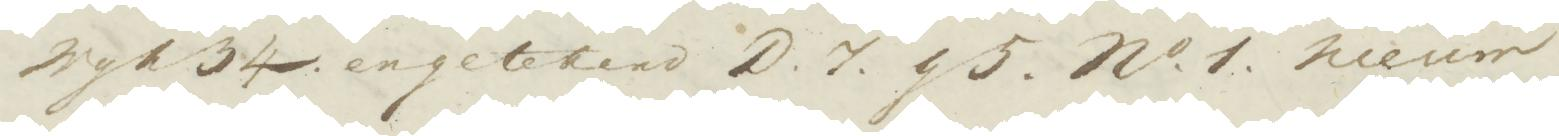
wyk 34. en getekend D. 7. 95. N.o 1. nieuw
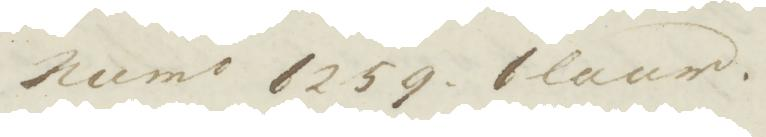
Numo 6259. blauw.
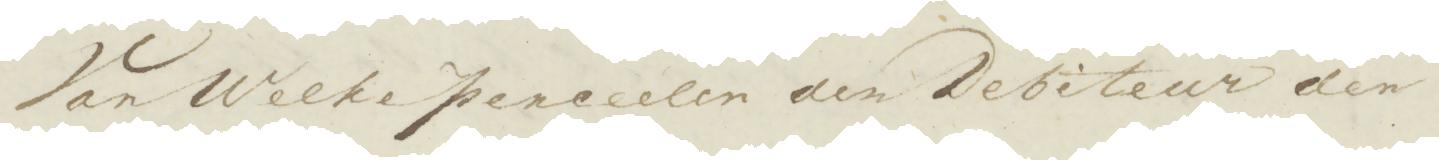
Van Welke perceelen den Debiteur den
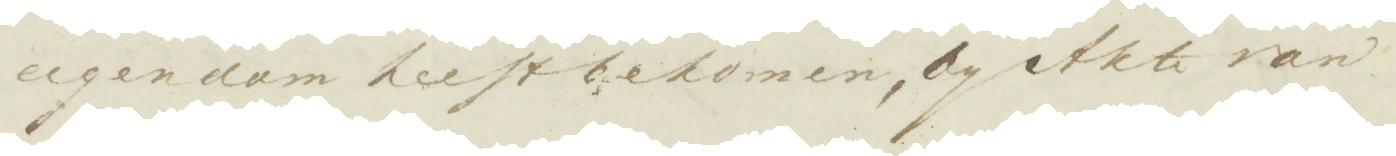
eigendom heeft bekomen, by Akte van
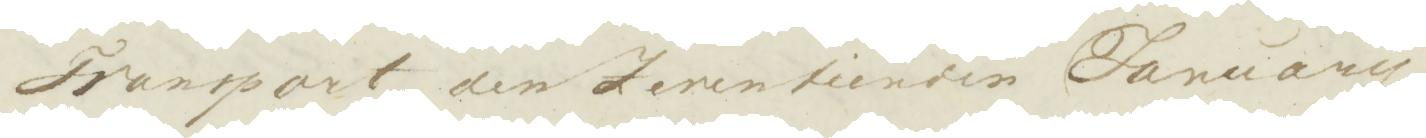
Transport den Zeventienden Januarij,
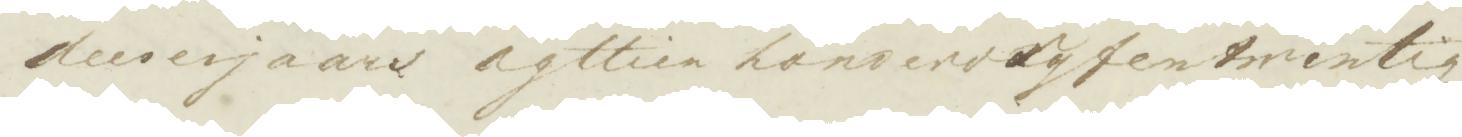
deeses jaars agttien honderd vyf en twintig
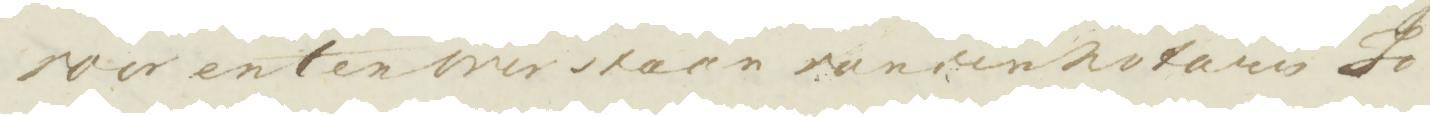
voor en ten overstaan van den notaris Jo
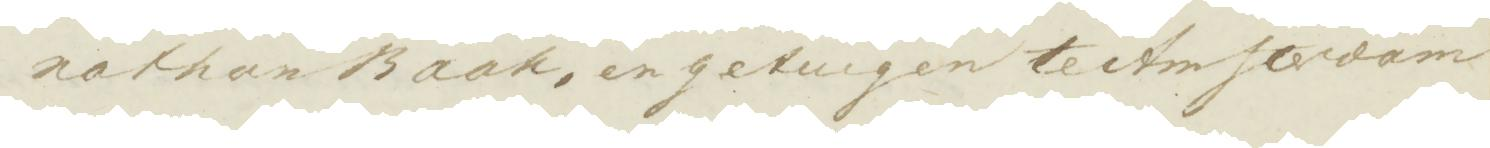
nathan Baak, en getuigen te Amsterdam
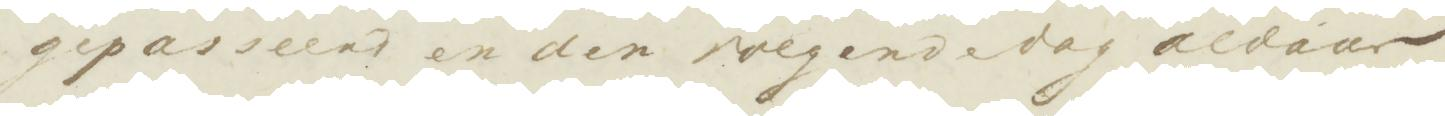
gepasseerd en den volgende dag aldaar
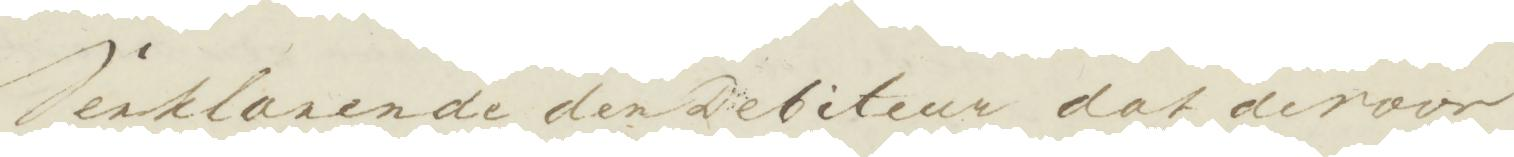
Verklarende den Debiteur dat de voor
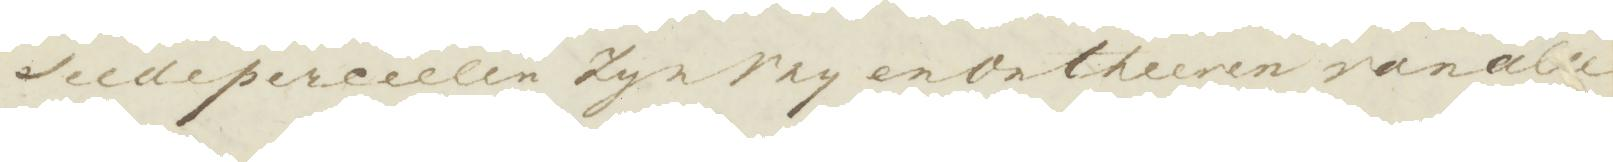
seide perceelen zyn vry en ontheeven van alle
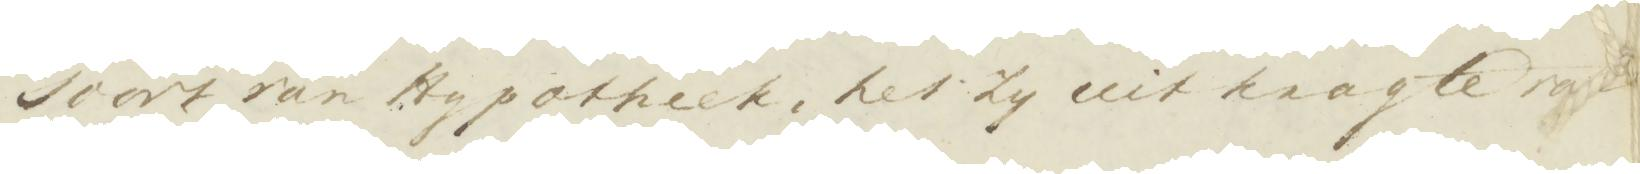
soort van Hypotheek, het zy uitkragte van
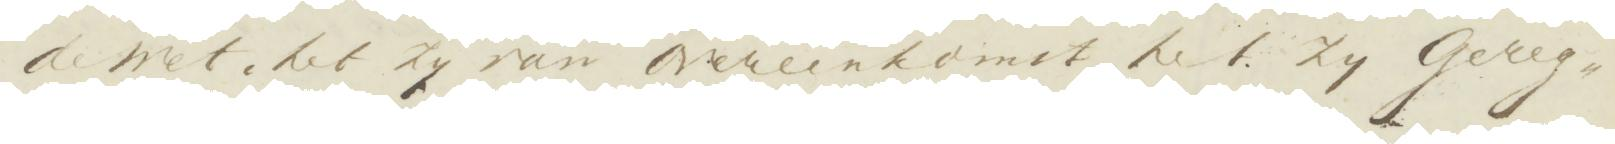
de wet, het zy van overeenkomst, het zy gereg„
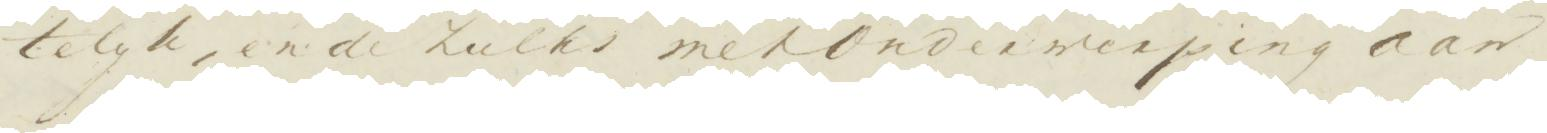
telyk, en de zulks met onderwerping aan
